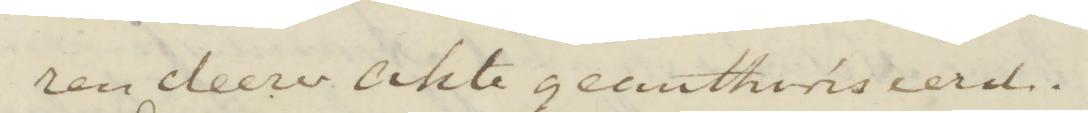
ren deeze akte geauthoriseerd..
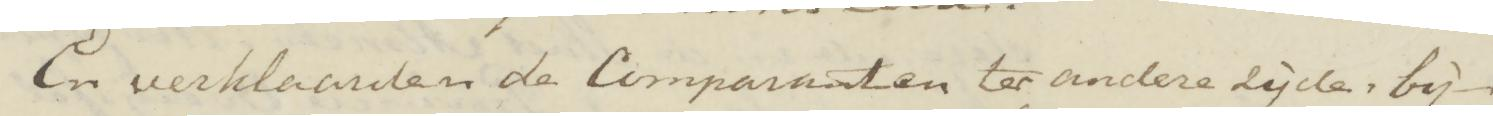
En verklaarden de Comparant en ter andere zijde, bij
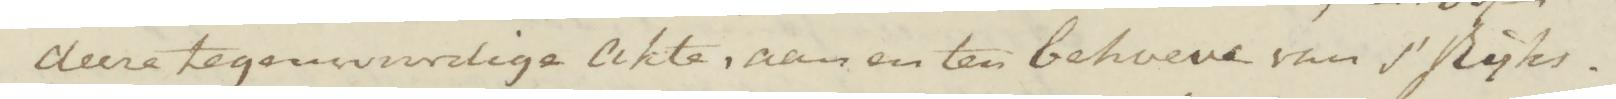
deeze tegenwoordige Akte, aan en ten behoeve van s Rijks.
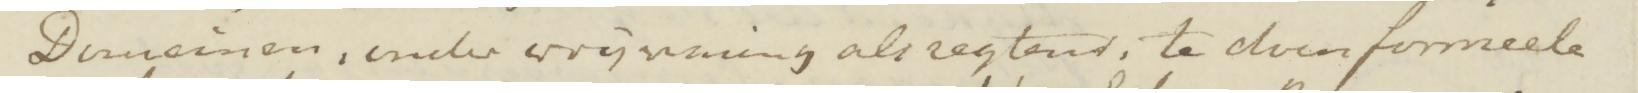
Domeinen, onder vrijwaring als regtens, te doen formeele
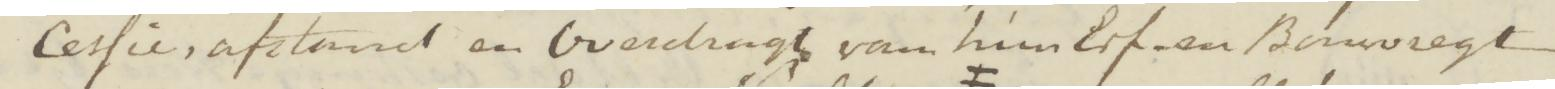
Cessie, afstand en Overdragt van hun Erf en Bouwregt
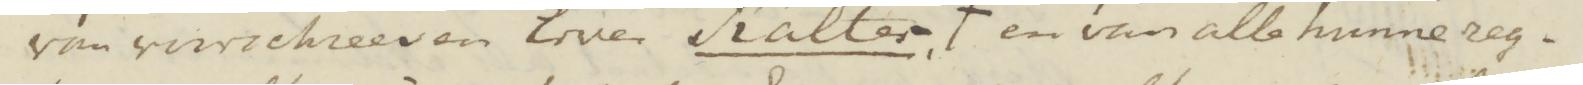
van voorschreeven Erve Kalter, ¶ en van alle hunne reg„
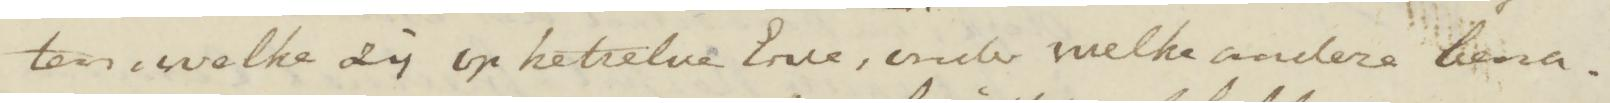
ten, welke zij op hetzelve Erve, onder welke andere bena.
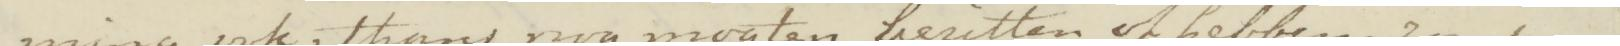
ming ook, thans nog mogten bezitten of hebben, zonder
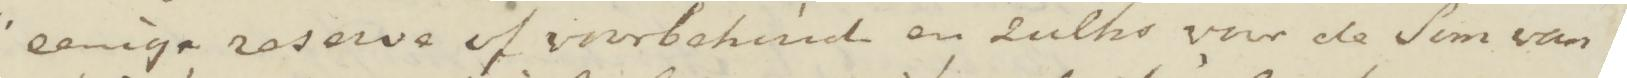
eenige reserve of voorbehoud en zulks voor de Som van
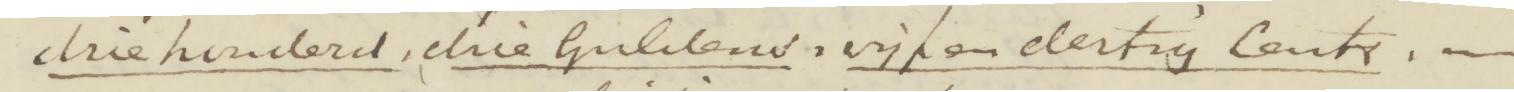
drie honderd, drie Guldens vijf en dertig Cents.—
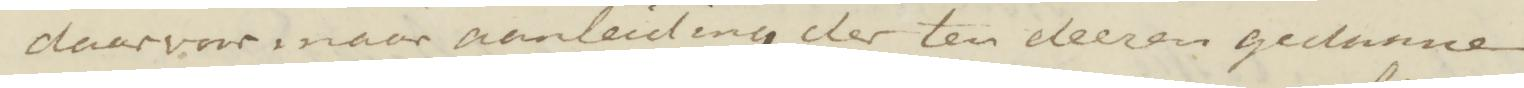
daarvoor naar aanleiding der ten deezen gedaane
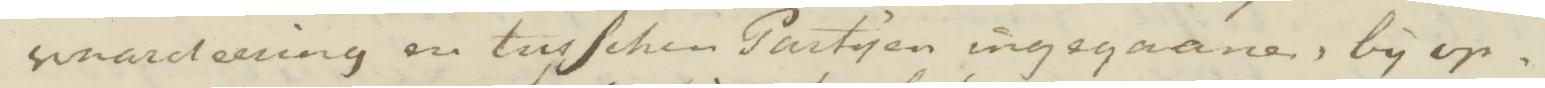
waardeering en tusschen Partijen ingegaane, bij op
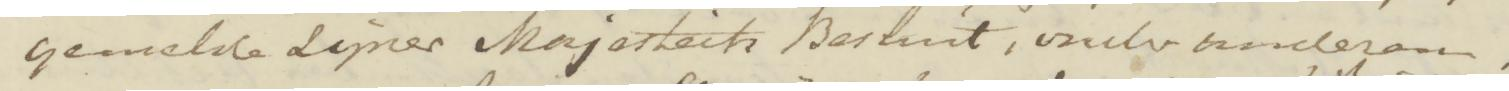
gemelde zijner Majesteits Besluit, onder anderen.
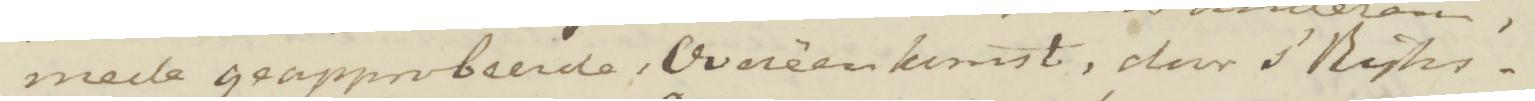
mede geapprobeerde, Overeenkomst, door s' Rijks-
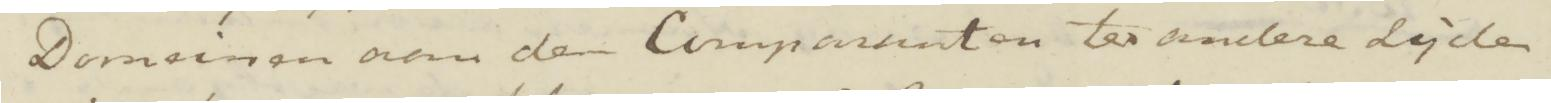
Domeinen aan den Comparanten ter andere zijde
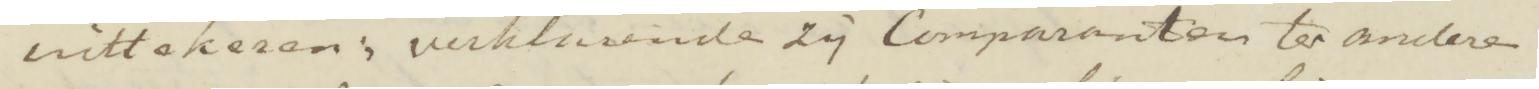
uittekeren; verklarende zij Comparanten ter andere
